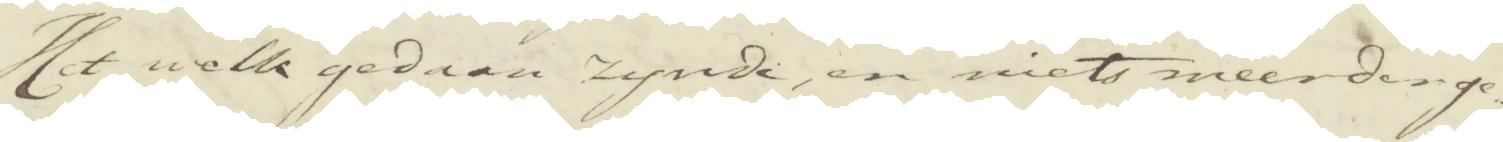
Het welke gedaan zynde, en niets meerder ge„
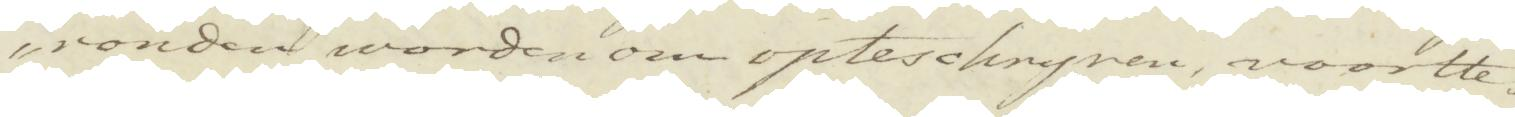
„vonden worden om op te schrijven, voortte„
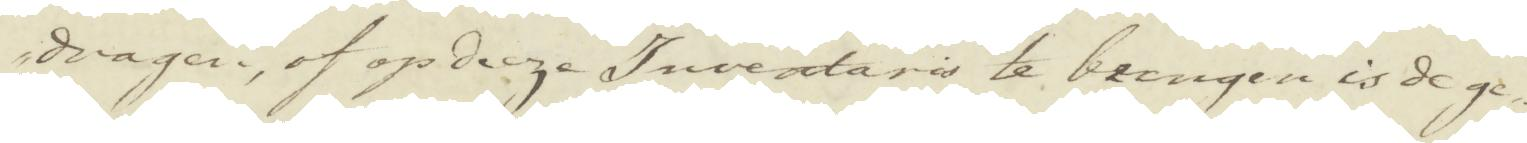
„dragen, of op deeze Inventaris te brengen is de ge„
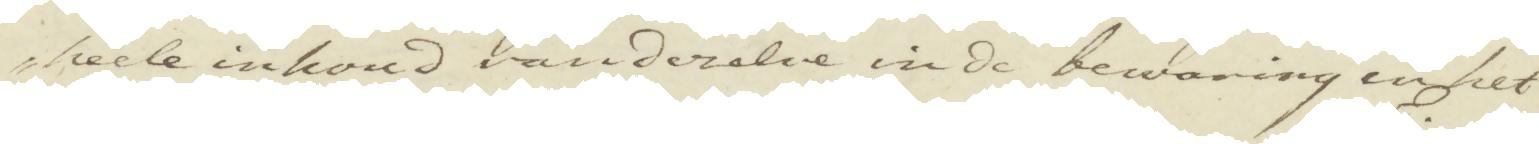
„heele inhoud van dezelve in de bewaring en het
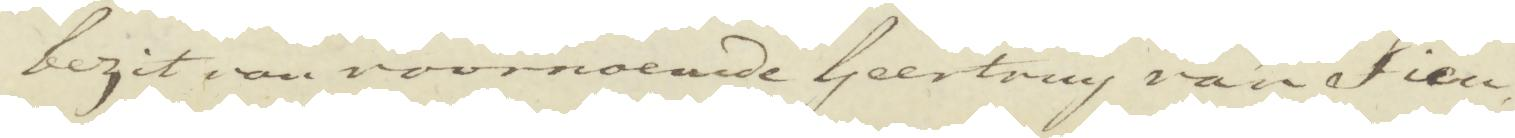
bezit van voornoemde Geertruy van Tien,
